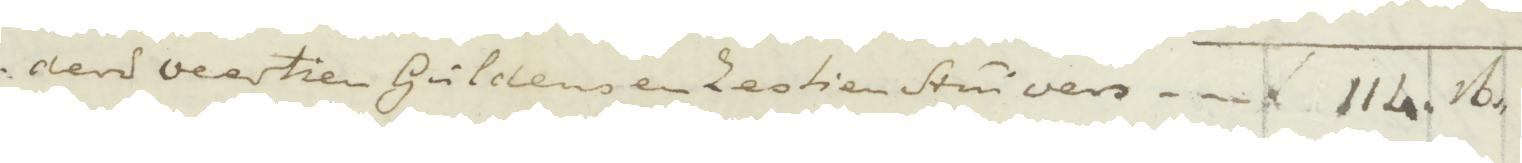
„ders veertien Guldens en Zestien Stuivers - - - ƒ 114. 16:
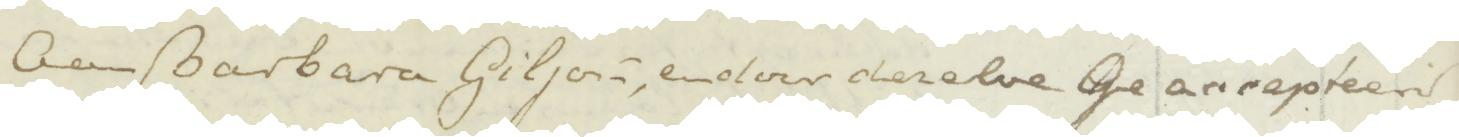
Aen Barbara Giljou, en door dezelve Geaccepteerd
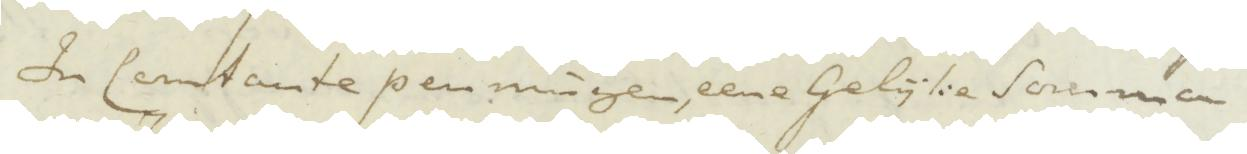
In Contante penningen, een Gelijke somma
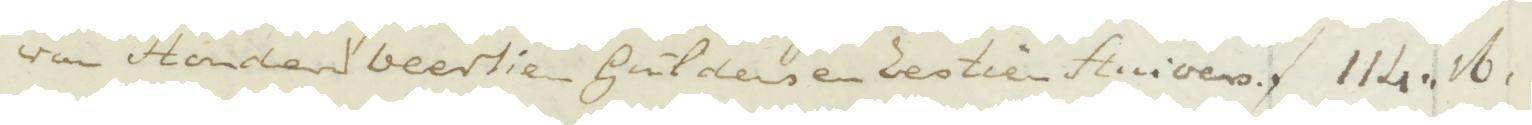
van Honderd veertien Guldens en Zestien stuivers. ƒ 114: 16.
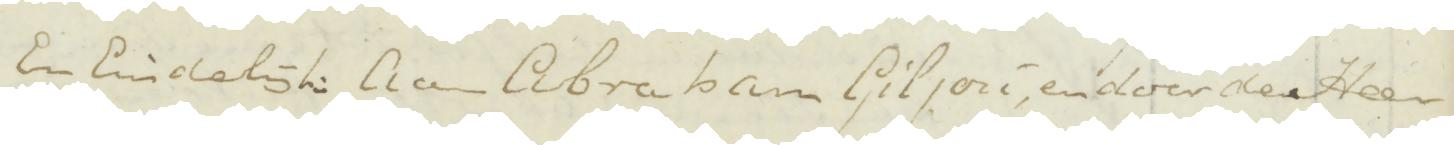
En Eindelijk Aan Abraham Giljou, en door de Heer
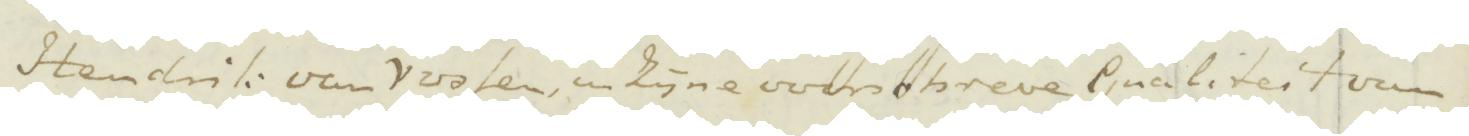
Hendrik van Vossen, in zijne voorschreve qualiteit van
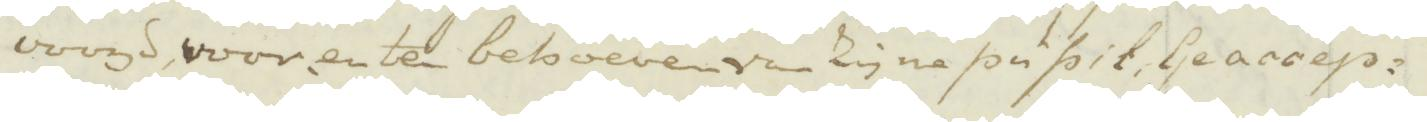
voogd, voor, en ten behoeven van zijne pupil, Geaccep:
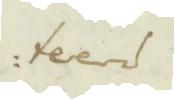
:teerd
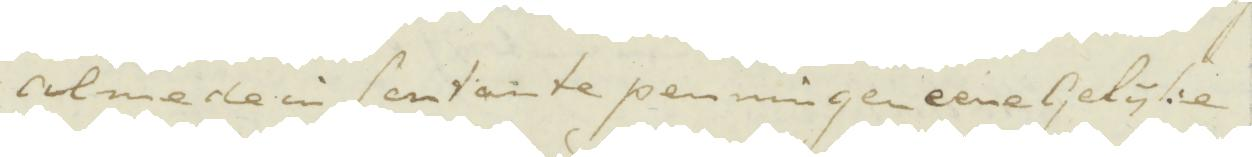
almede in Contante penningen eene Gelijke
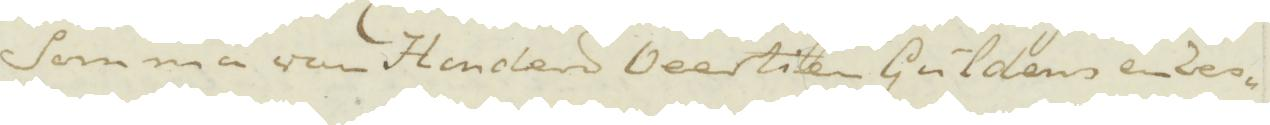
Somma van Honderd Veertien Guldens en zes„
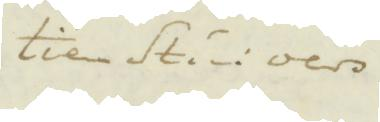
tien Stuivers
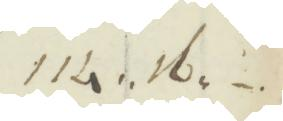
ƒ 141„16„ – .
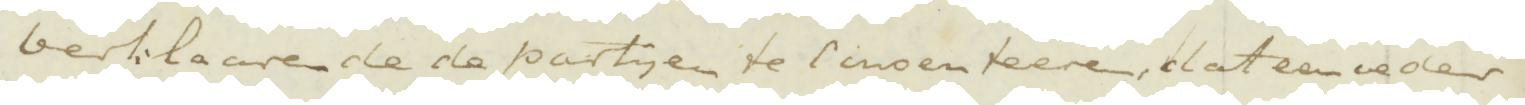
verklaarde de partijen te consenteere, dat een ieder
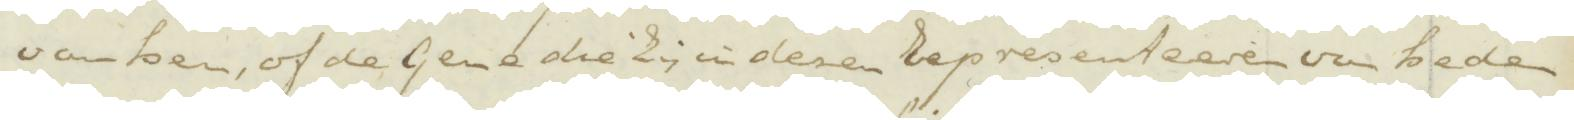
van hen, of de Gene die zij in desen Representeeren van heden
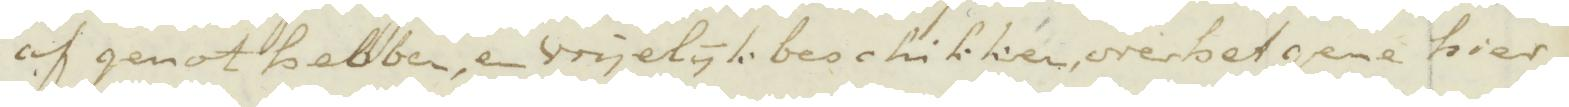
af genot hebben, en vrijelijk beschikken, over het gene hier
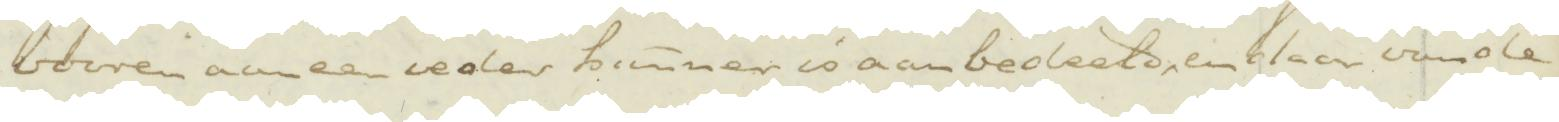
vooren aan een ieder hunner is aanbedeeld, en daar van de
